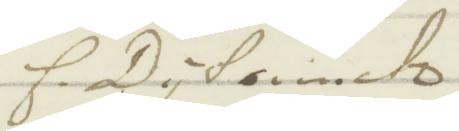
C Dijserinck
